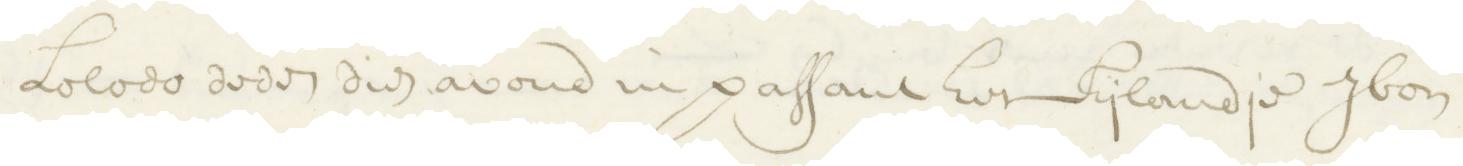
Lolodo deden dien avond in passant het Eijlandje Jbon
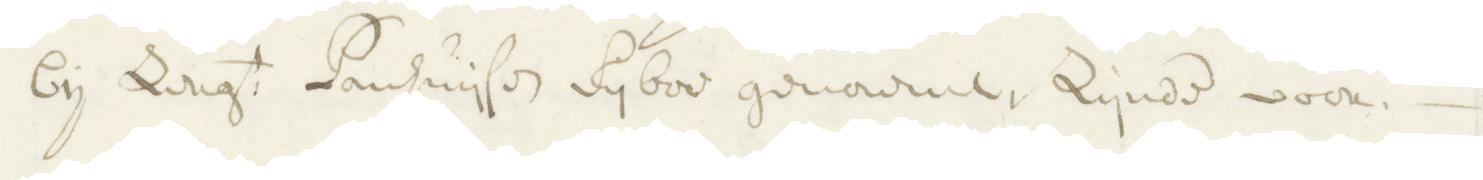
bij zerg:t Panhuijsen Eijboe genaemt, zijnde voor. —
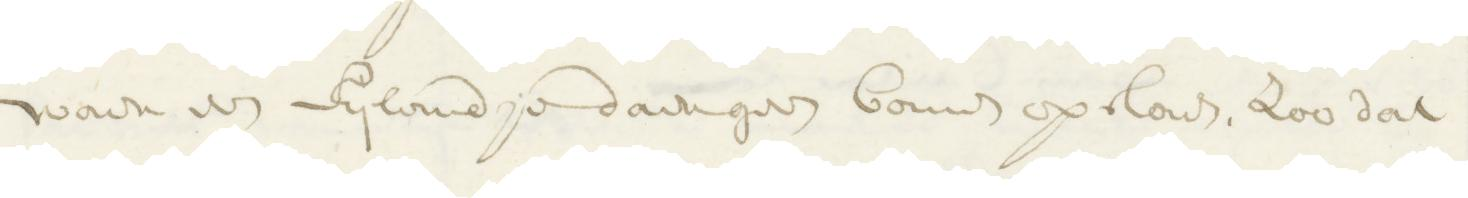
waer een Eijlandje daer geen bomen opstaen, zoo dat
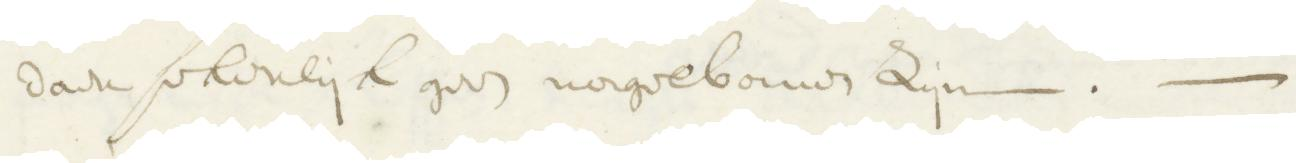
daer sekerlijk geen nagelbomen zijn. —
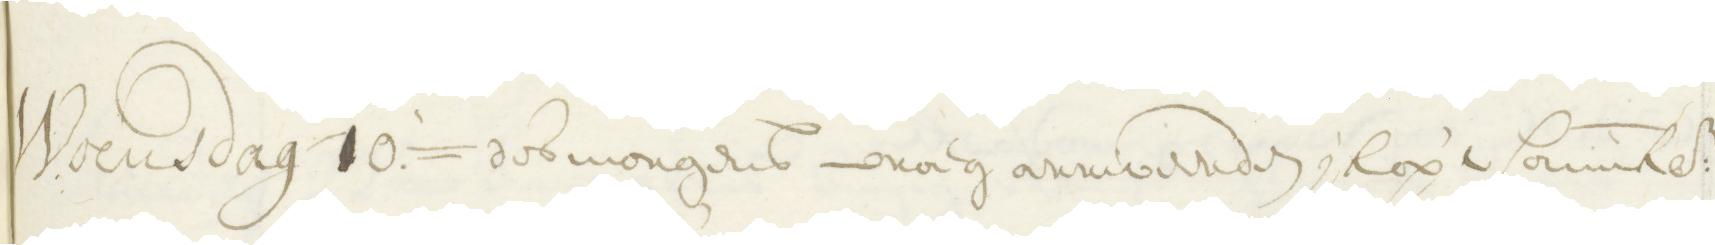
Woensdag 10.=' des morgens vroeg arriveerden jk op 't Coninklijk
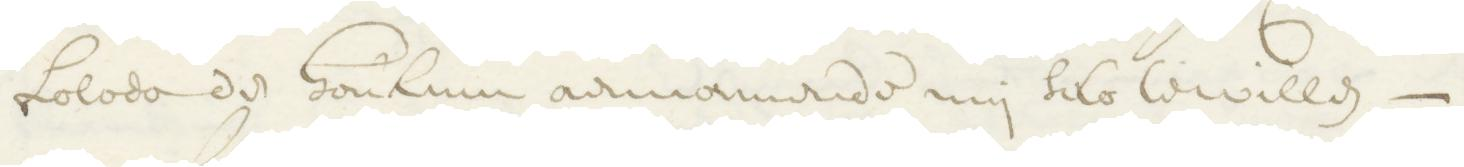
Lolodo den houkum aennamende mij silo te willen —
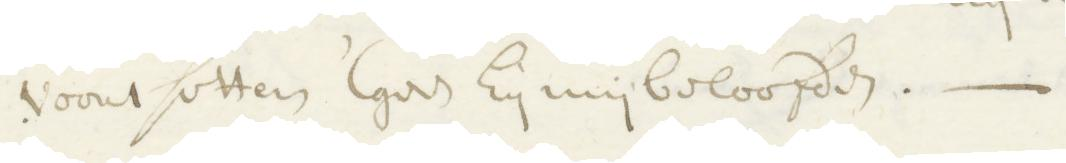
voort setten 'tgeen hij mij beloofden. —
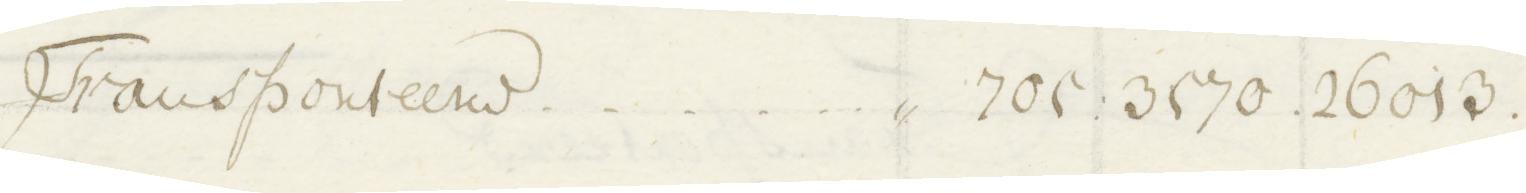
Transporteere . - - - . . „ 705: 3570: 26013.
